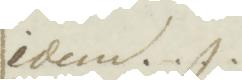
idem . . . . . . . . . . . .
